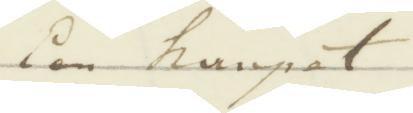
Een lampet
